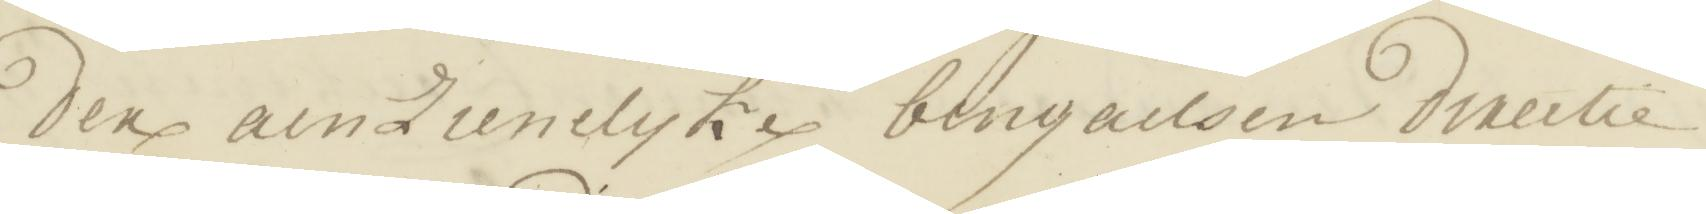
der aenzienelyke bengaelsen directie
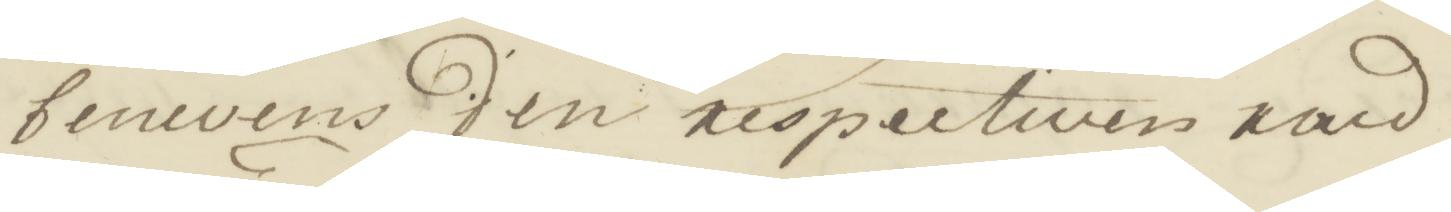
benevens den respectieven raed
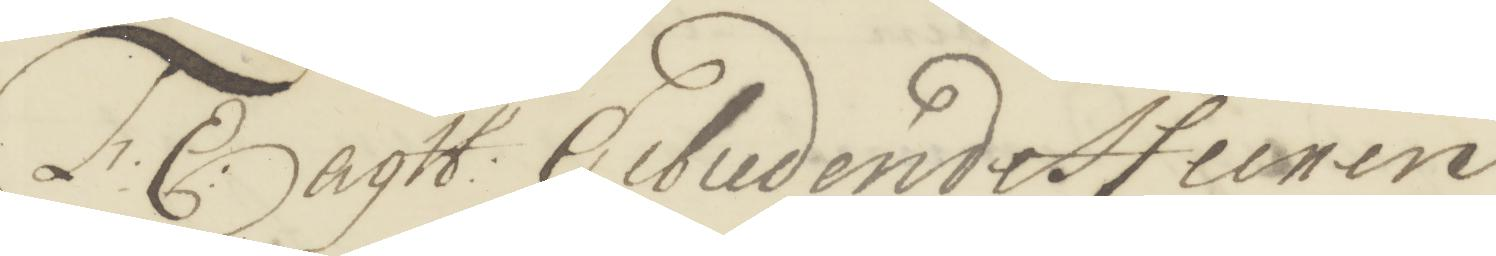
E: E: agtb: Gebiedende Heeren
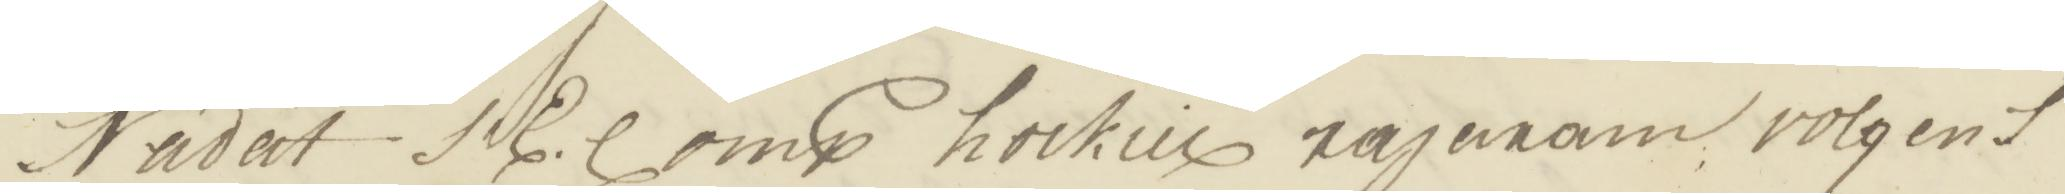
Nadat sE. Comp hockin rajaram volgens
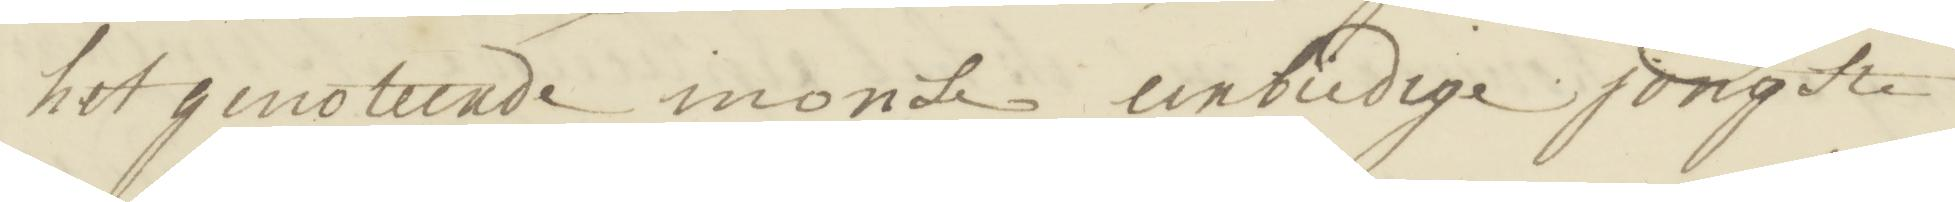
het genoteerde in onse eerbiedige jongste
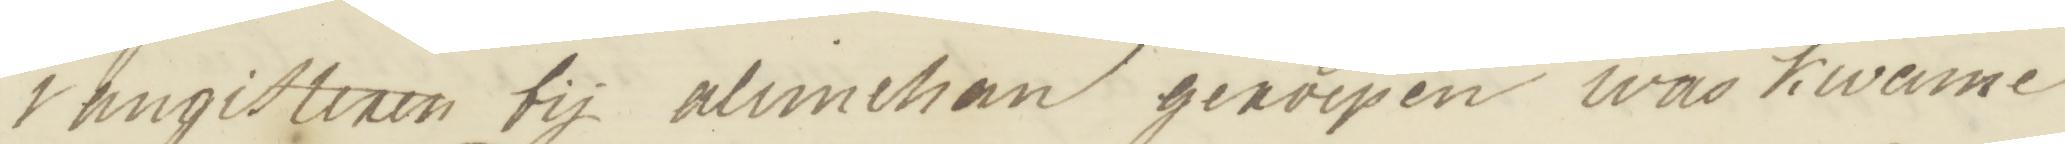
van gisteren bij alimchan geroepen was kwame
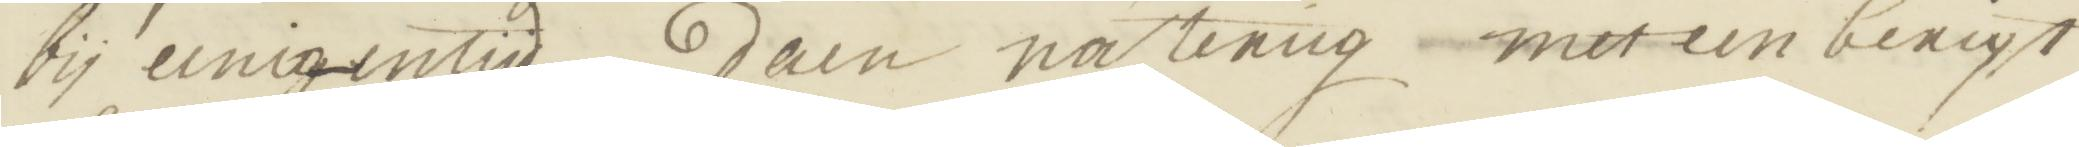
bij eenigen tijd daer na terug met een berigt
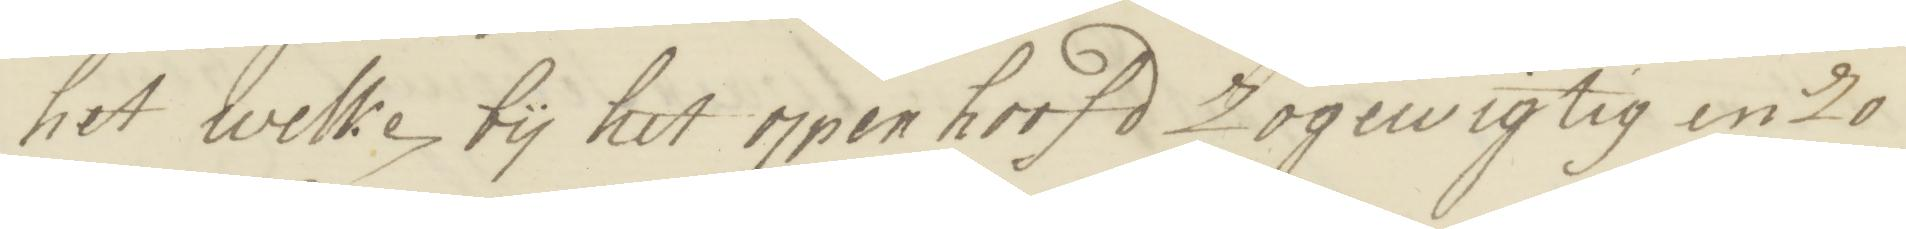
het welke bij het opperhoofd Zo gewigtig en Zo
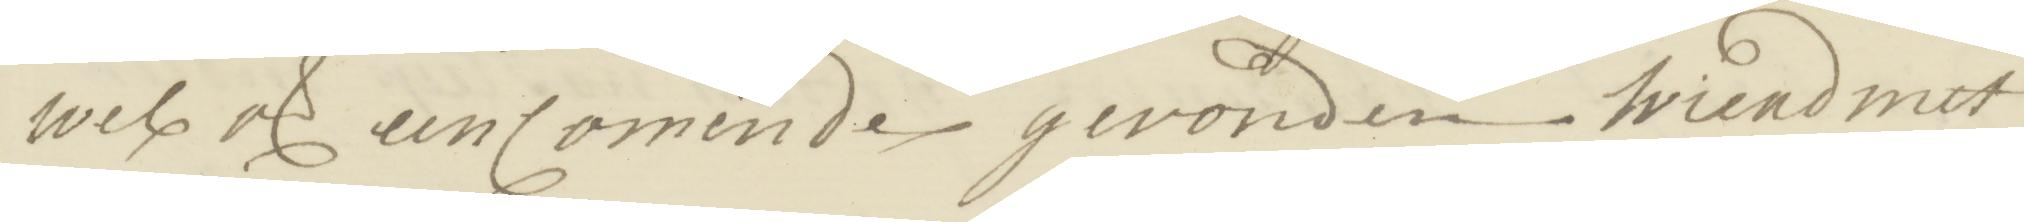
wel overeen comende gevonden wierd met
